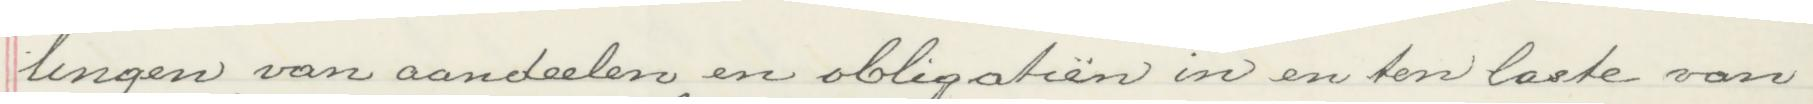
lingen van aandeelen en obligatiën in en ten laste van
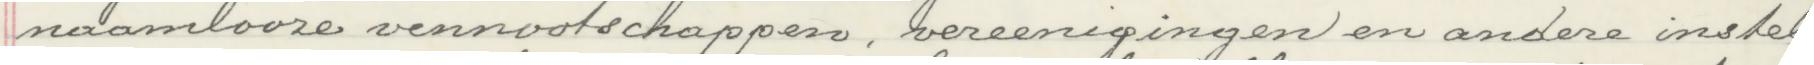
naamlooze vennootschappen, vereenigingen en andere instel
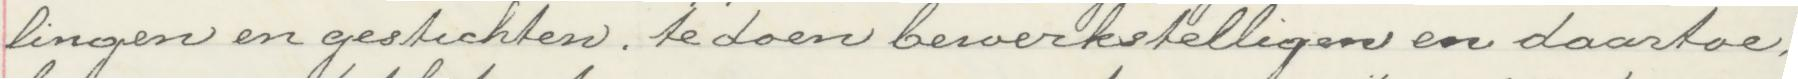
lingen en gestichten, te doen bewerkstelligen en daartoe,
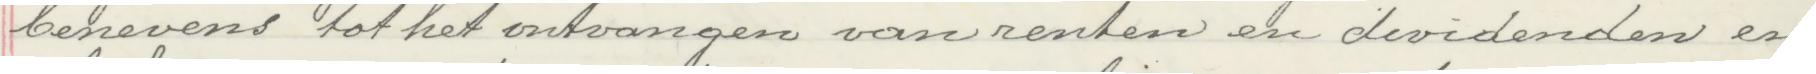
benevens tot het ontvangen van renten en dividenden en
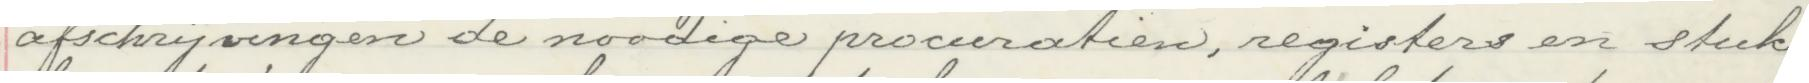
afschrijvingen de noodige procuratien, registers en stuk
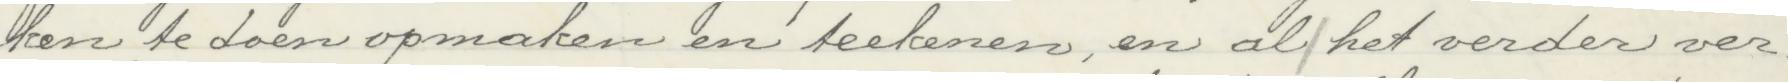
ken te doen opmaken en teekenen, en al het verder ver
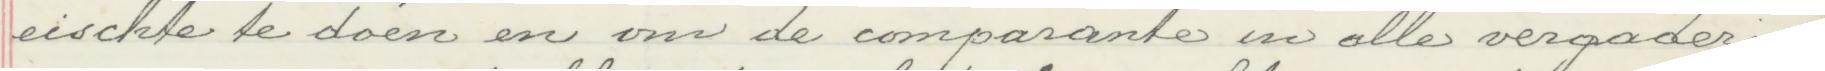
eischte te doen en om de comparante in alle vergaderin
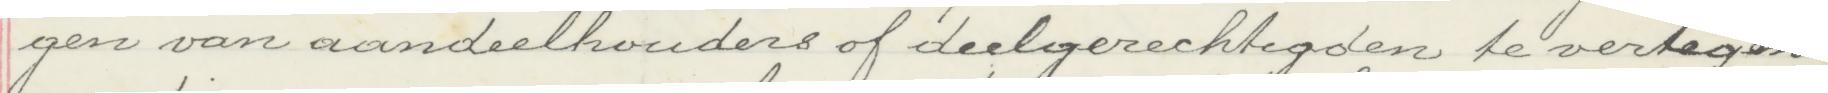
gen van aandeelhouders of deelgerechtigden te vertegen
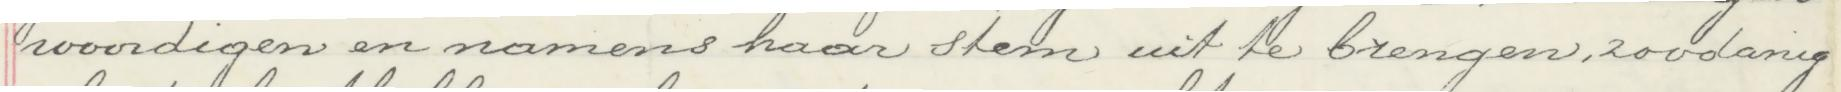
woordigen en namens haar stem uit te brengen, zoodanig
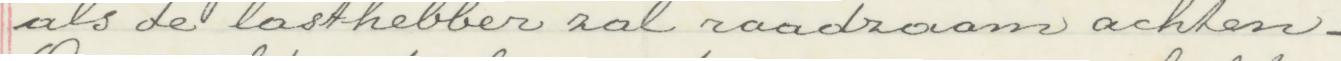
als de lasthebber zal raadzaam achten
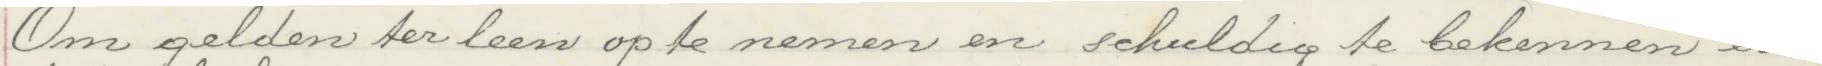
Om gelden ter leen op te nemen en schuldig te bekennen en
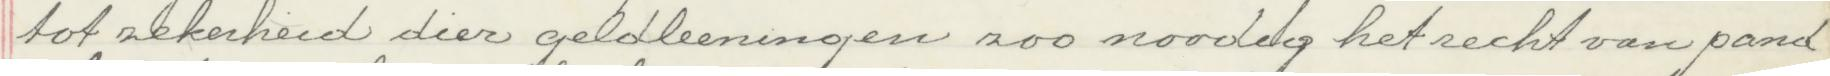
tot zekerheid dier geldleeningen zoo noodig het recht van pand
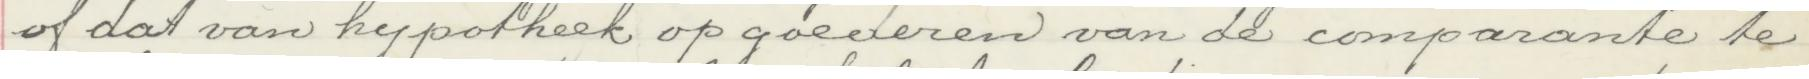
of dat van hypotheek op goederen van de comparante te
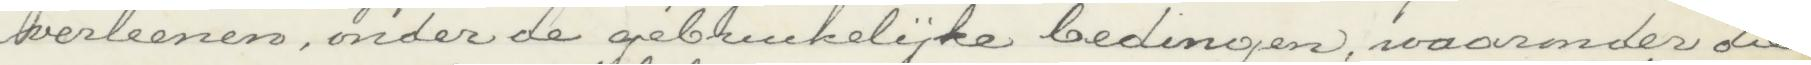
verleenen, onder de gebruikelijke bedingen, waaronder die
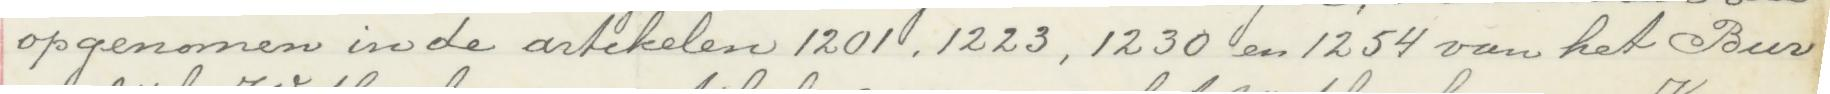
opgenomen in de artikelen 1201, 1223, 1230 en 1257 van het Bur
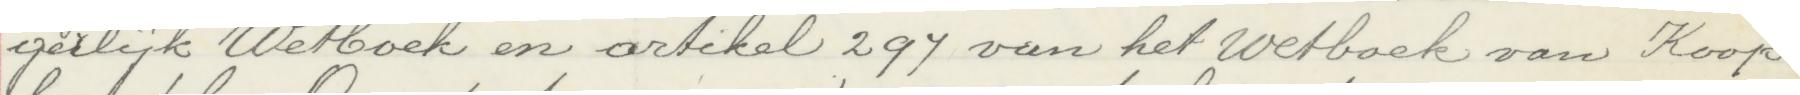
gerlijk Wetboek en artikel 297 van het Wetboek van Koop
